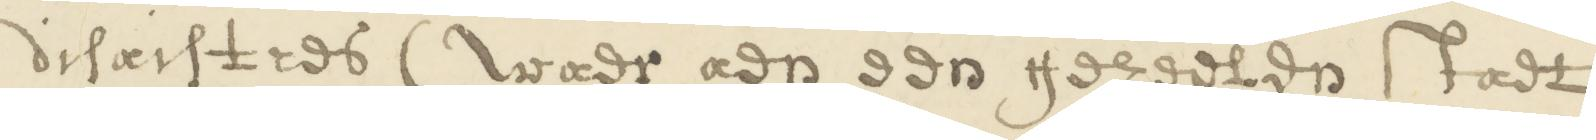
disaistres ( waer aen een geheelen staet
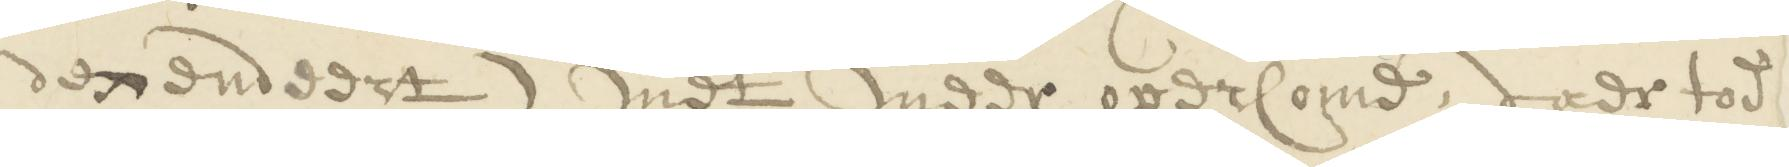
dependeert ) niet meer overcome, daer toe
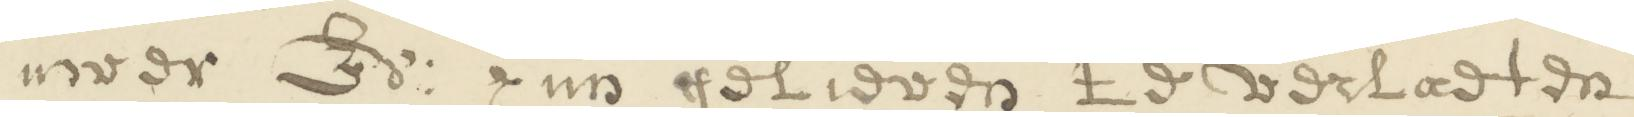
uwer Ed:' x un gelieven te verlaeten
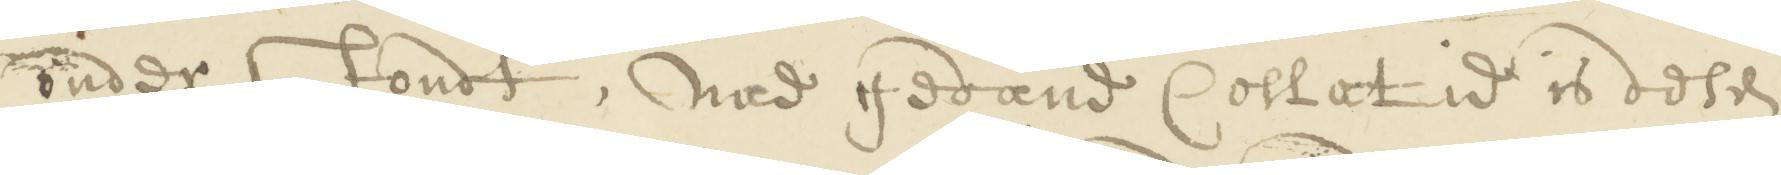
onder stondt, nae gedane Collatie is desen
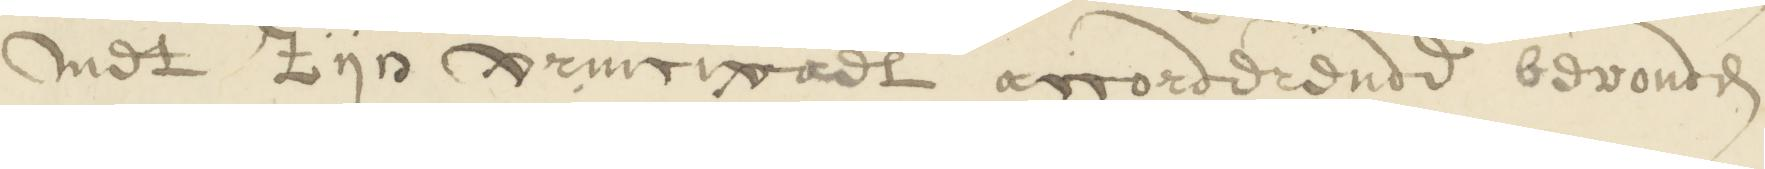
met zijn principael accorderende bevonden
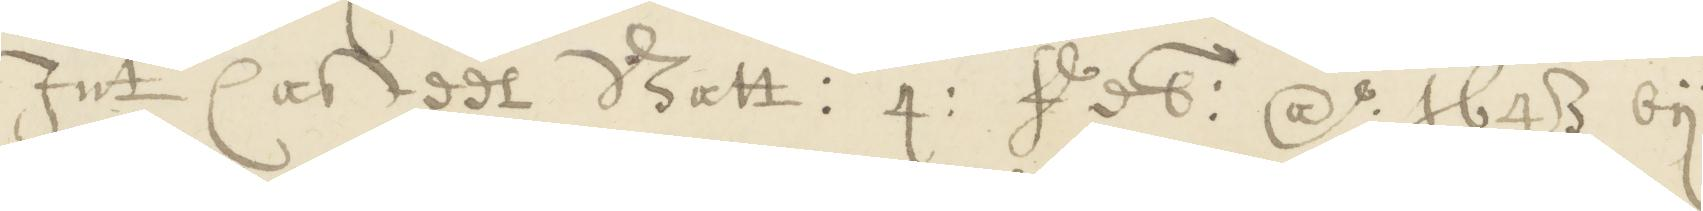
Jnt Casteel Batt:a 4: feb: @:o 1623 bij
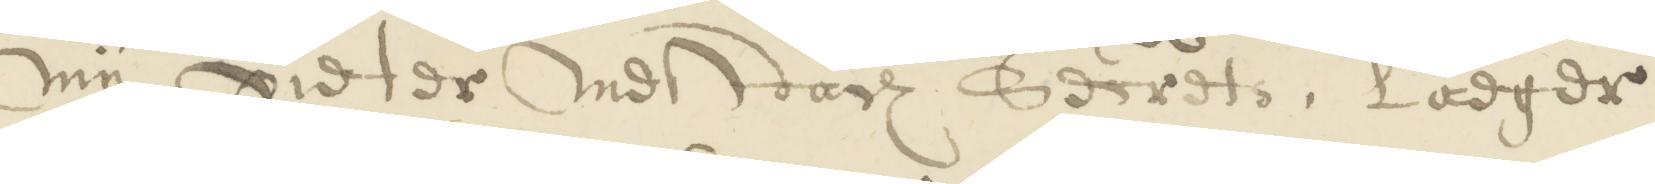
mij pieter mestdagh secrets, Laeger
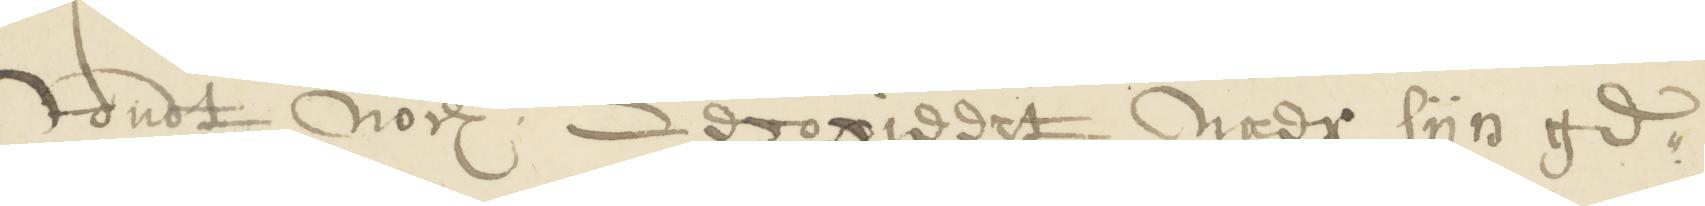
stondt noch Gecopieert naer sijn ge„
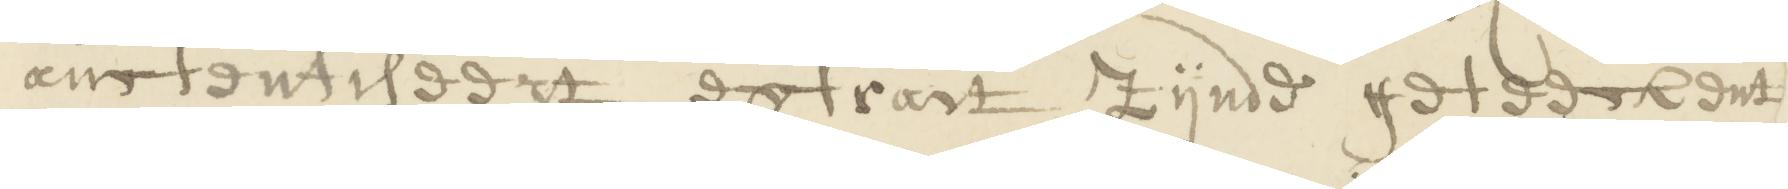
auctentiseert extract zijnde geteeckent
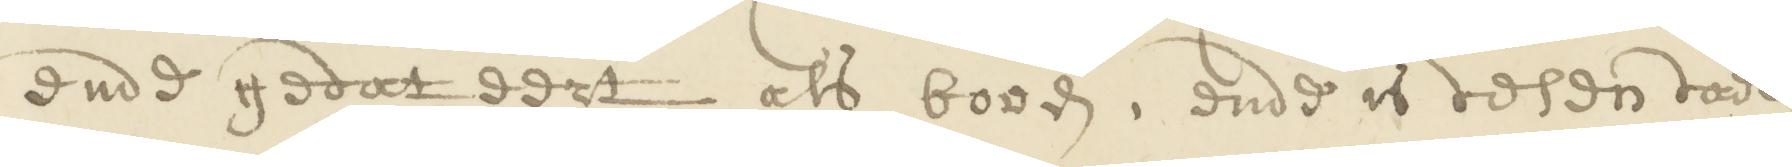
ende gedateert als boven, ende is desen daer
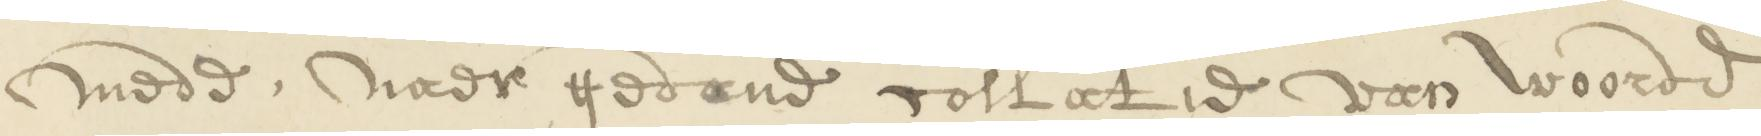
mede, naer gedane collatie van woorde
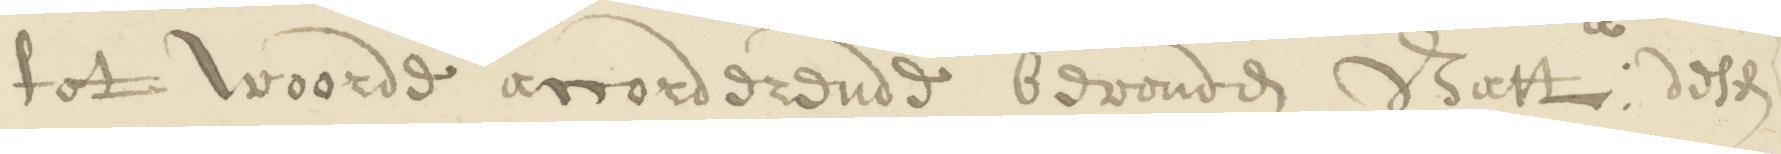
tot woorde accorderende bevonden Batt:a desen
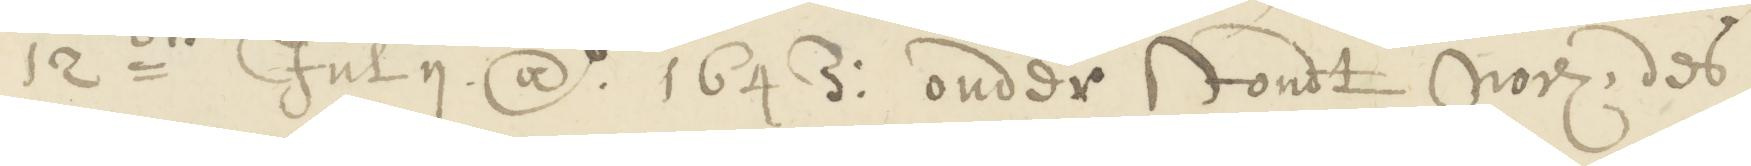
12=en Julij @.o 1643: onder stondt noch, des
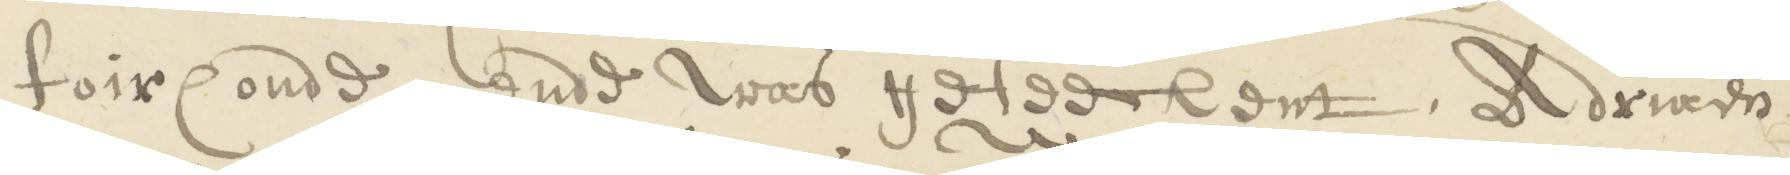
toirconde ende was geteeckent, Adriaen
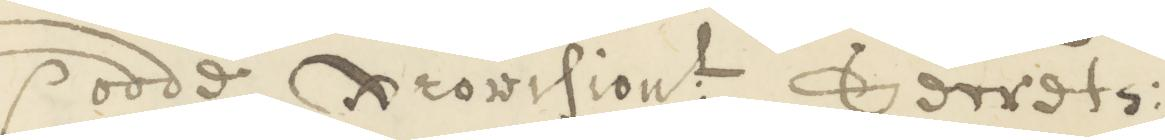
Codde provision:t secrets:
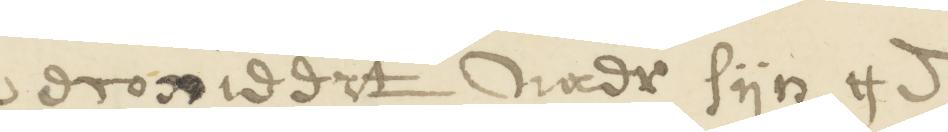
Gecopieert naer sijn ge
